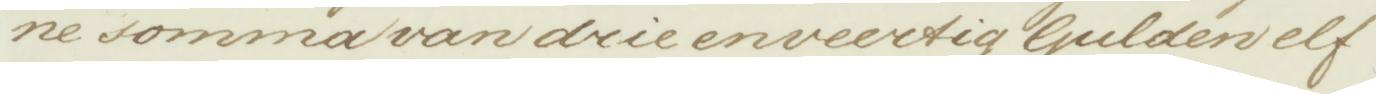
ne somma van drie en veertig Gulden elf
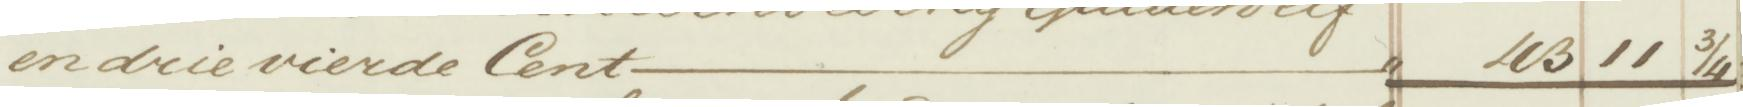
en drie vierde Cent „ 43 11¾
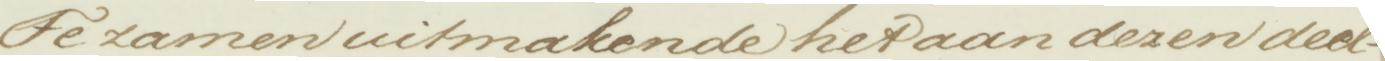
Te zamen uitmakende het aan dezen deel
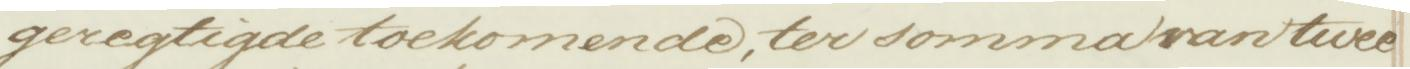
geregtigde toekomende, ter somma van twee
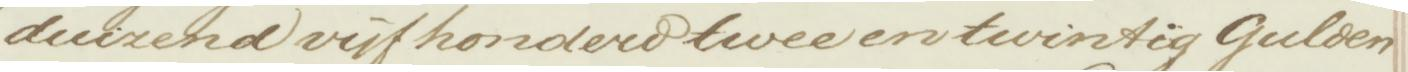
duizend vijf honderd twee en twintig Gulden
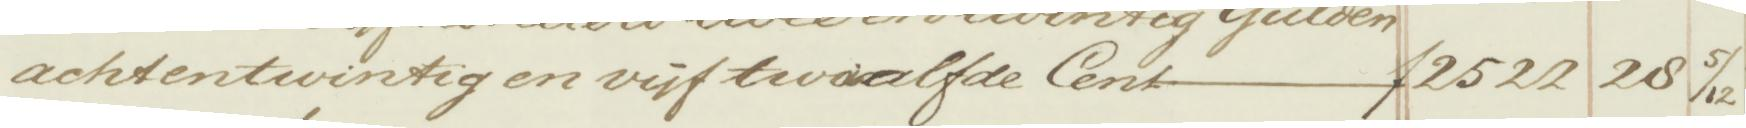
achtentwintig en vijf twaalfde Cent ƒ2522 28 5/12
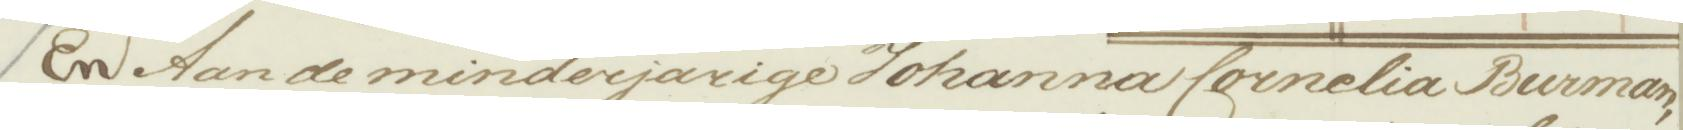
/En Aan de minderjarige Johanna Cornelia Burman
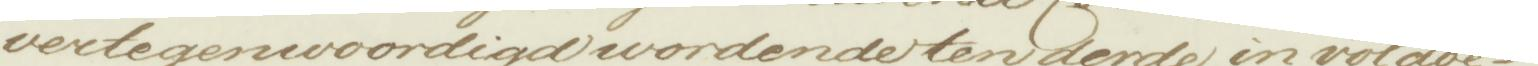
vertegenwoordigd wordende ten derde, in voldoe-
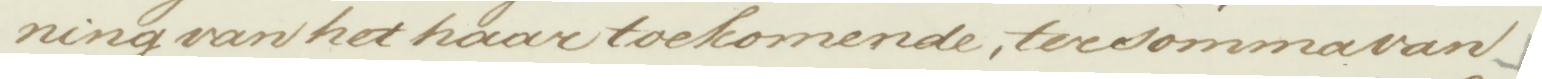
ning van het haar toekomende, ter somma van
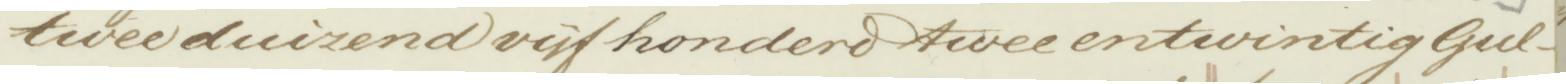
twee duizend vijf honderd twee en twintig Gul-
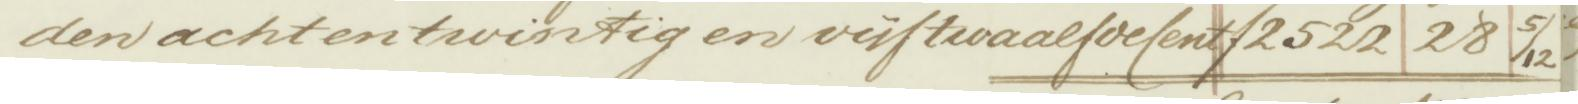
den acht en twintig en vijf twaalfde Cent ƒ 2522 28 5/12
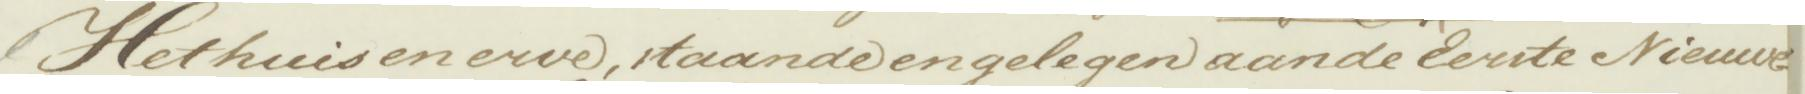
Het huis en erve, staande en gelegen aan de Eerste Nieuwe
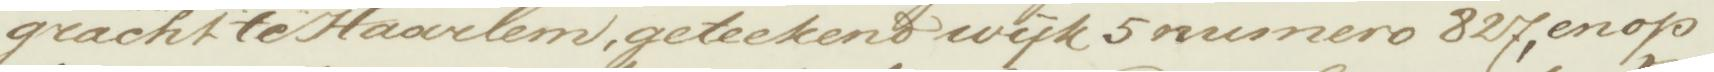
gracht te Haarlem, geteekend wijk 5 numero 827, en op
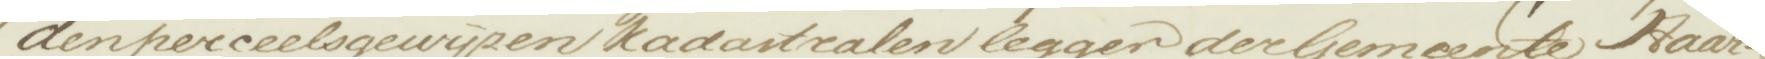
den perceelsgewijzen kadastralen legger der Gemeente Haar-
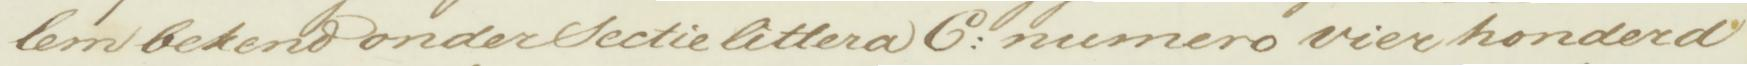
lem bekend onder sectie littera C: numero vier honderd
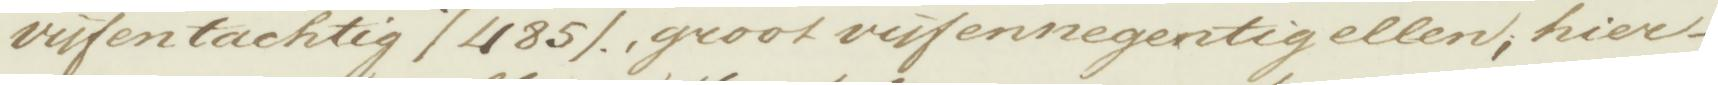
vijf en tachtig '/485/., groot vijf en negentig ellen, hier-
